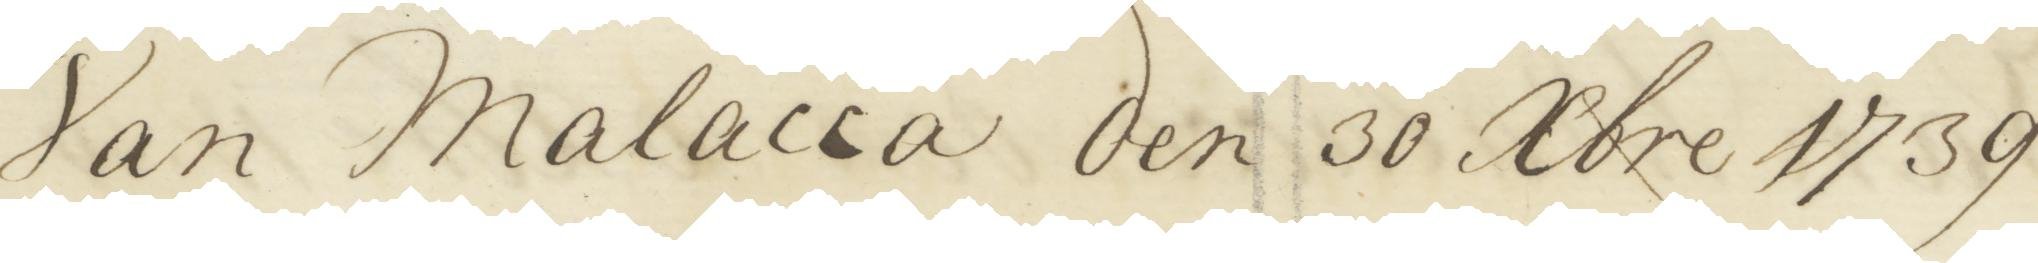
Van Malacca den 30 Xbre 1739
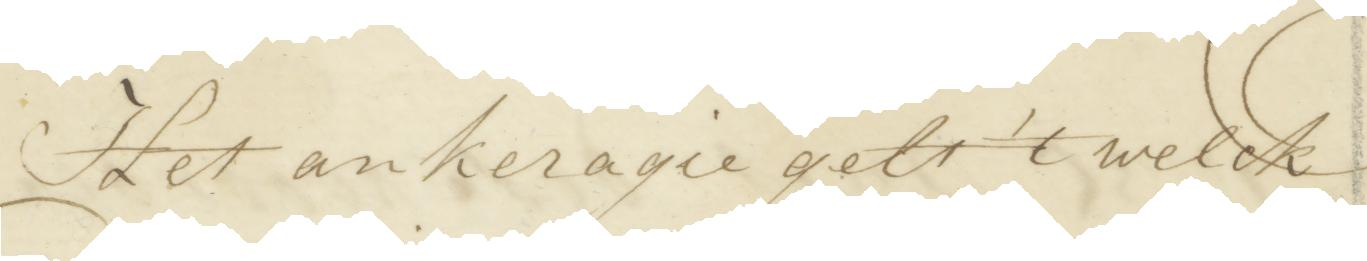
Het ankeragie gelt 't welck
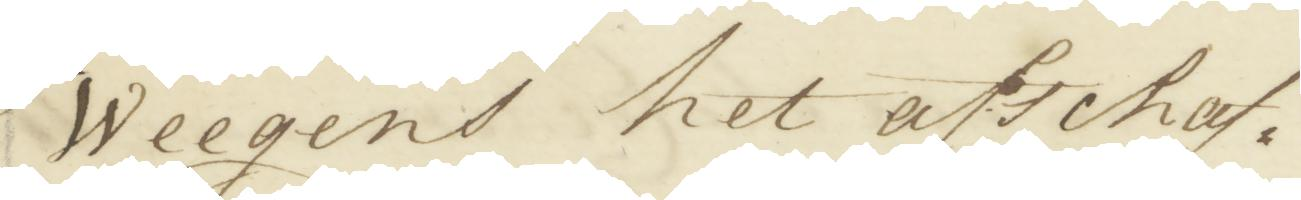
weegens het afschaf„
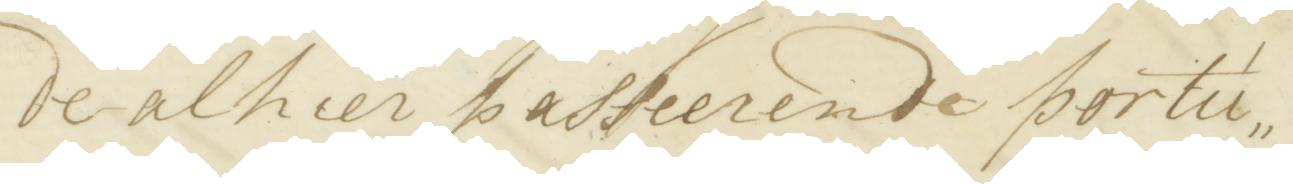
de alhier passeerende portu„
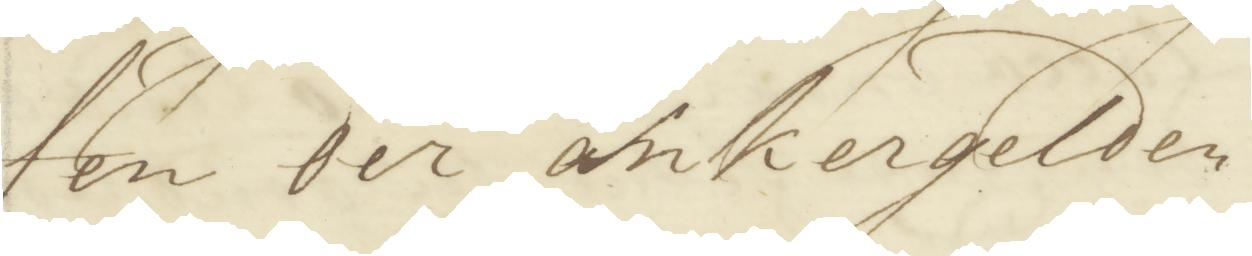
fen der ankergelden
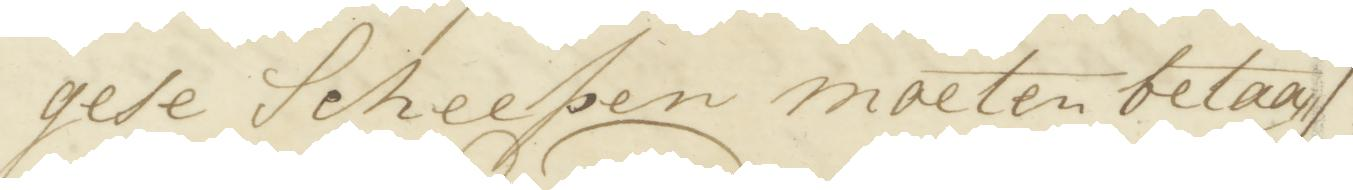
gese scheepen moeten betaa„
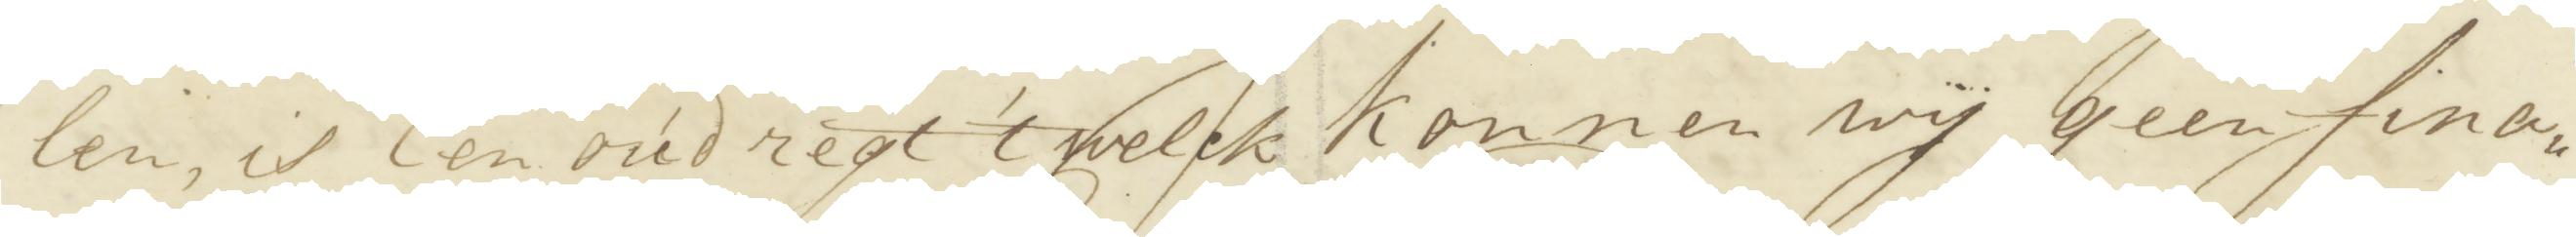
len, is Eeen oud regt 't welck konnen wij geen fina„
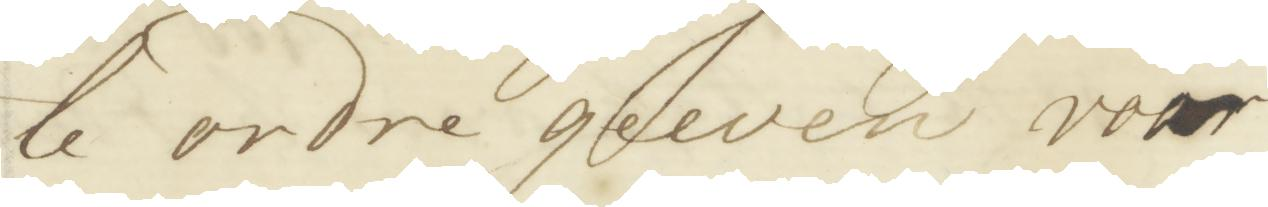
le ordre geeven voor
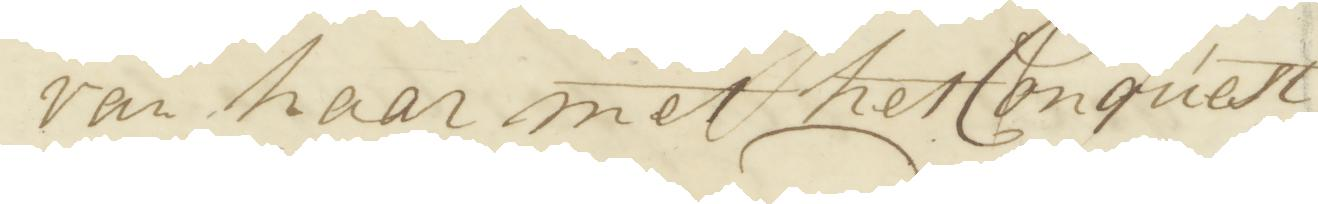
van haar met het Conquest
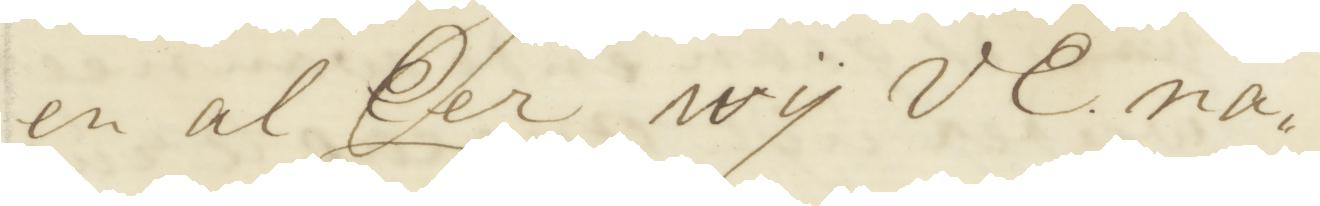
en al Eer wij UE. na„
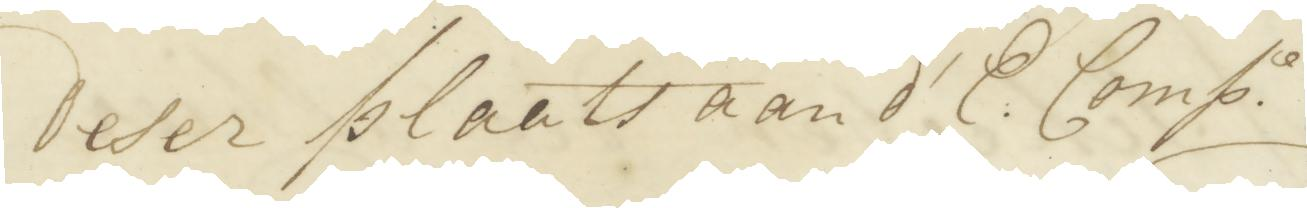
deser plaats aan d’ E. Comp.e
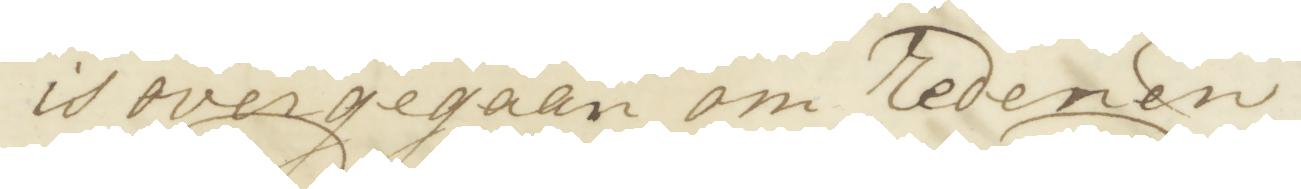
is overgegaan om redenen
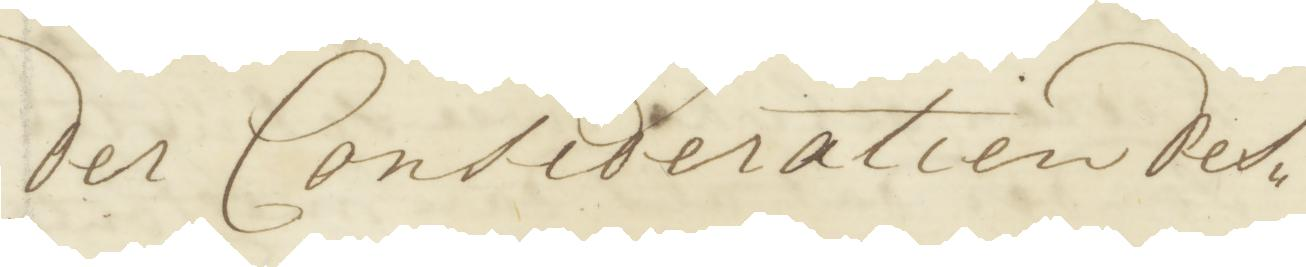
der Consideratien des„
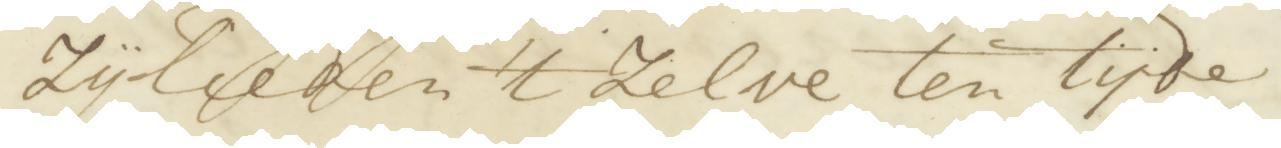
zij lieden 't zelve ten tijde
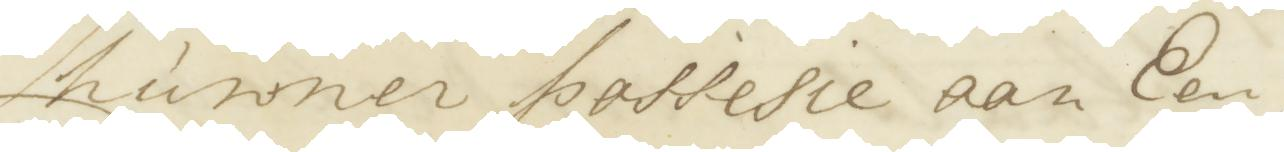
hunner possesie aan Een
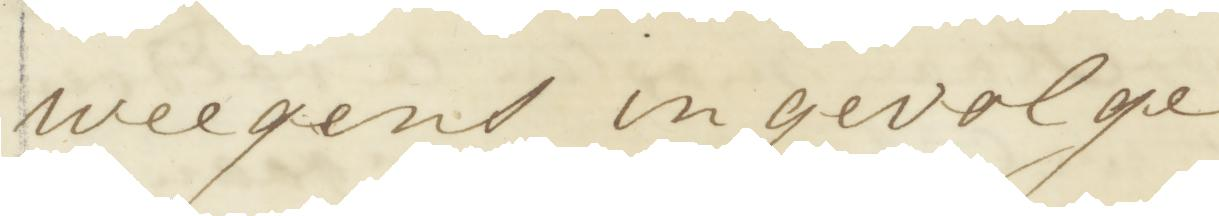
weegens in gevolge
